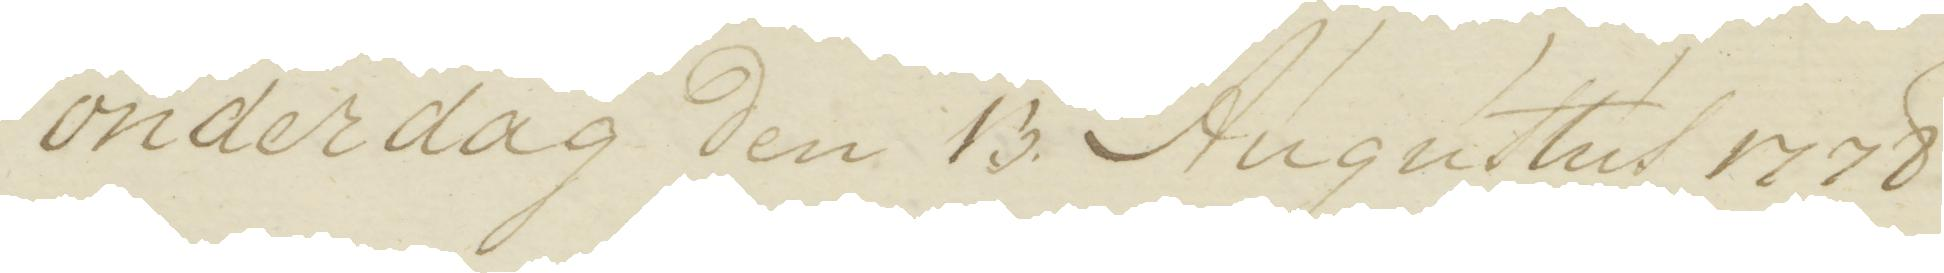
onderdag den 13. Augustus 1778
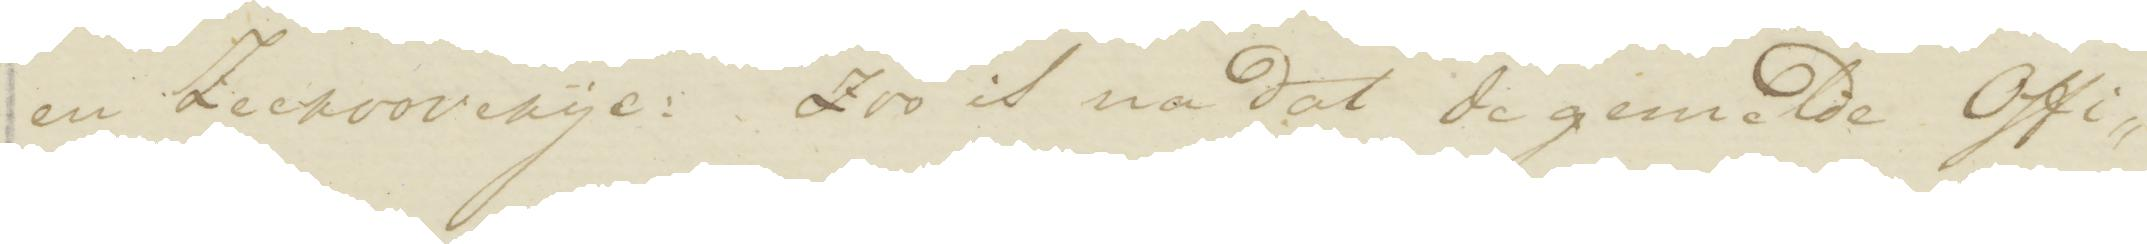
en zeerooverije: zoo is na dat de gemelde Offi„
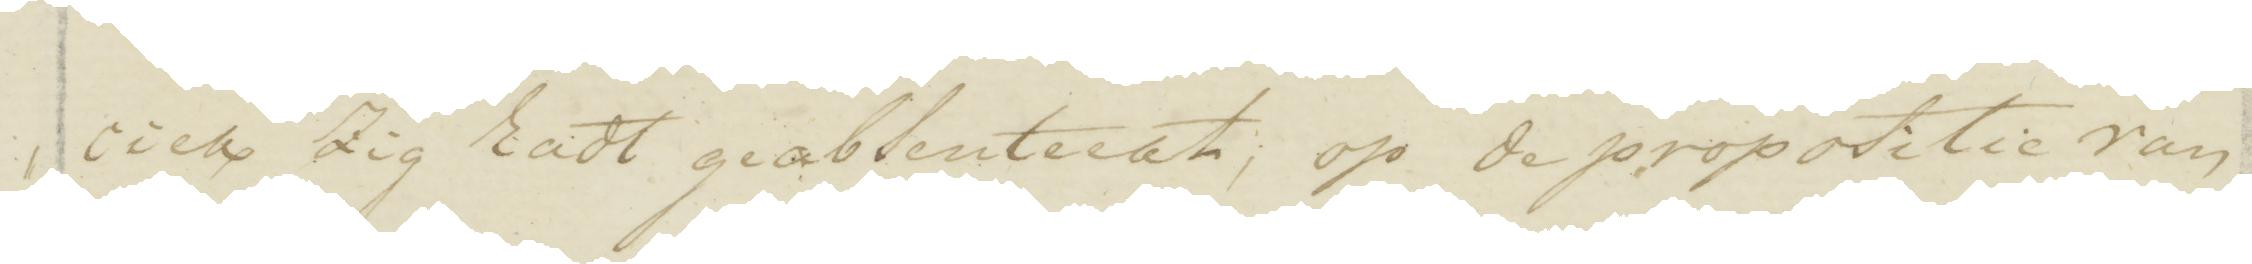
„cier zig hadt geabsenteert; op de propositie van
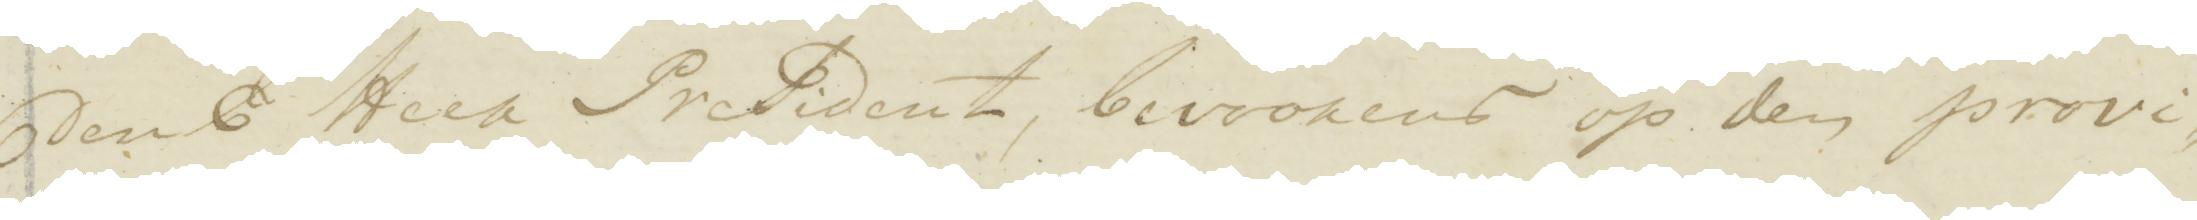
den E Heer President, bevorens op den provi
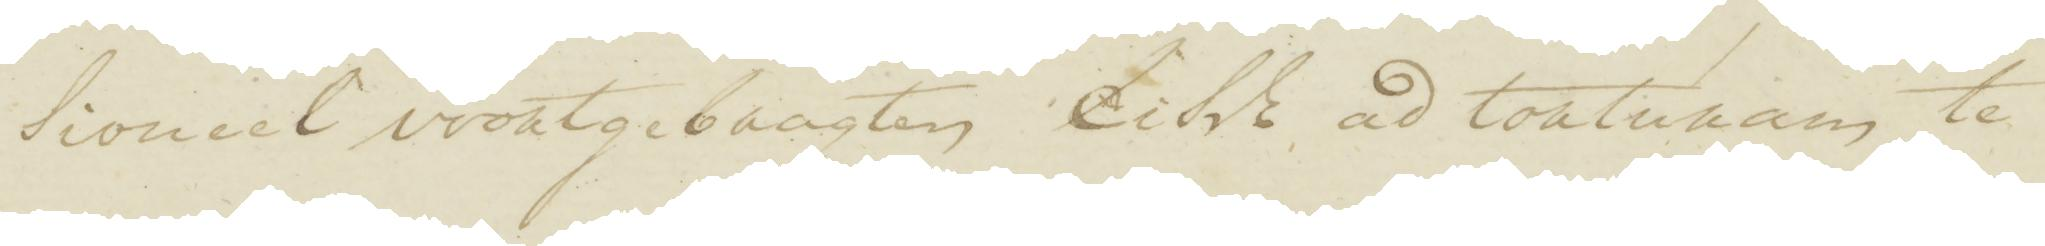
sioneel voortgebragten Eisch, ad torturam te
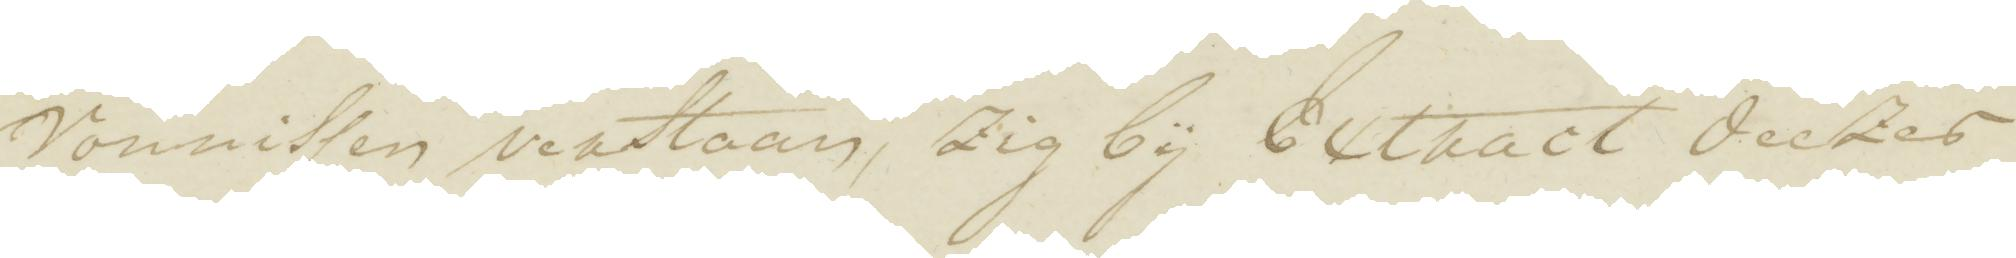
vonnissen verstaan, zig bij Extract deezes
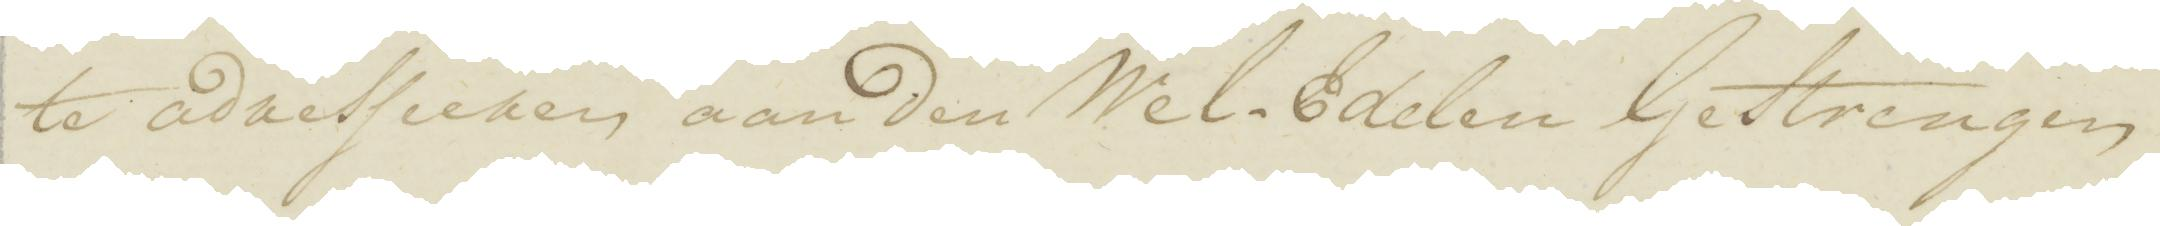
te adresseeren aan den Wel-Edelen Gestrengen
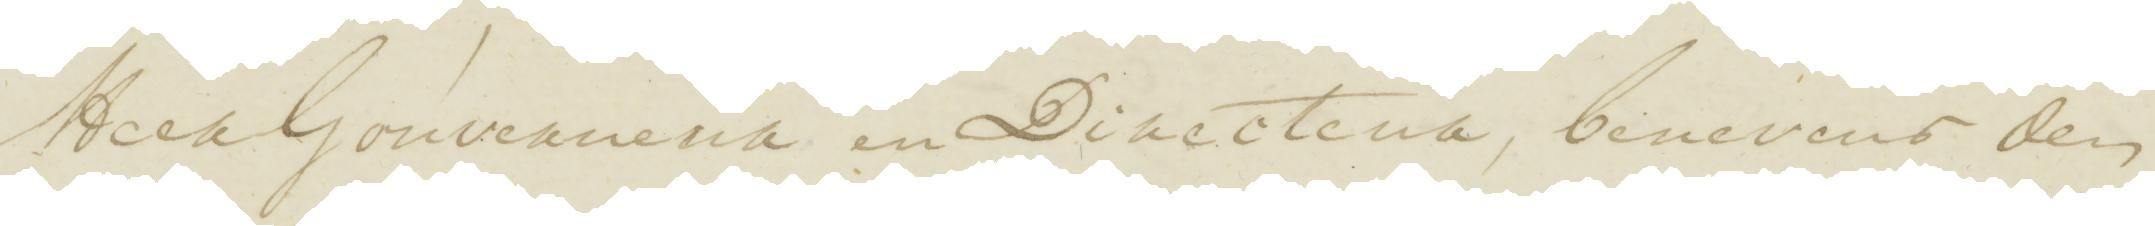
Heer Gouverneur en Directeur, benevens den
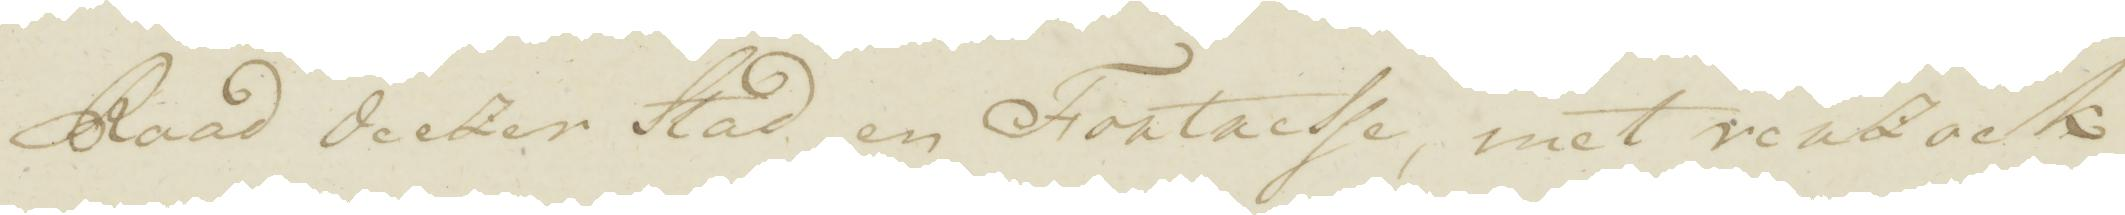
Raad deezer stad, en Fortresse, met verzoek
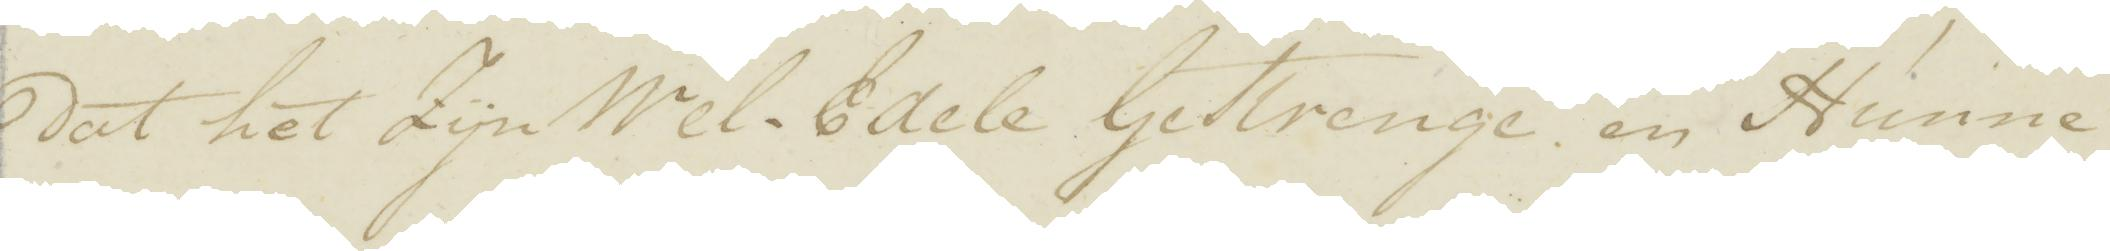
dat het zijn Wel-Edele Gestrenge, en Hunne
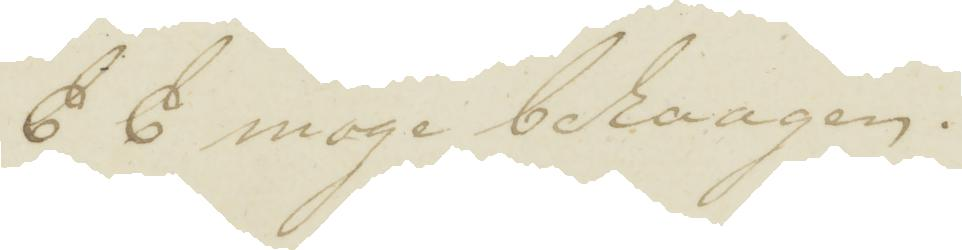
E E moge behaagen.
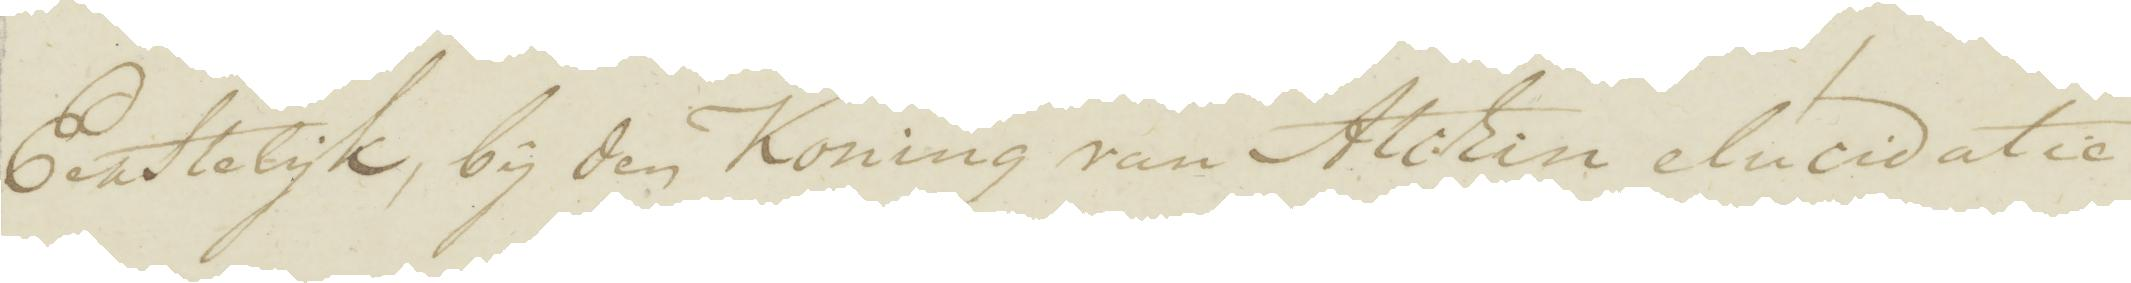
Eerstelijk, bij den koning van Atchin elucidatie
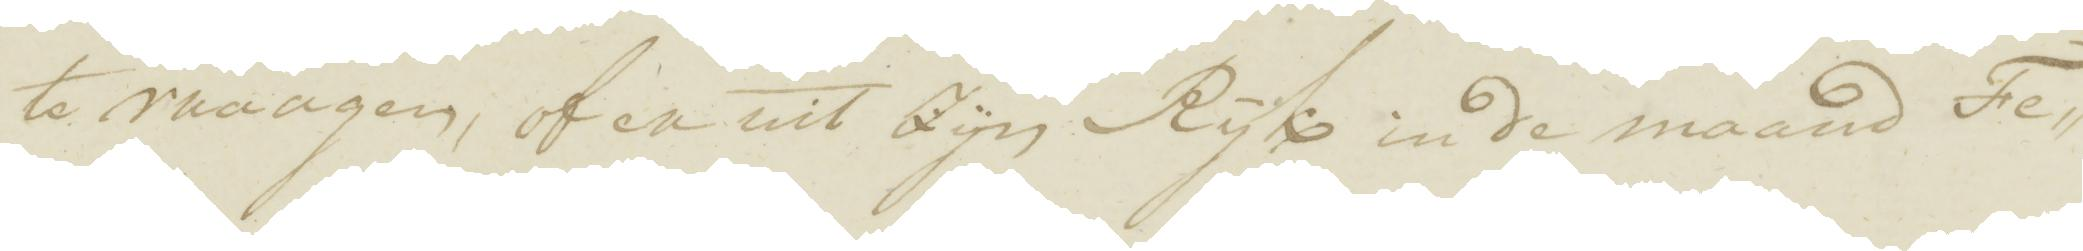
te vraagen, of en uit zijn Rijk in de maand Fe
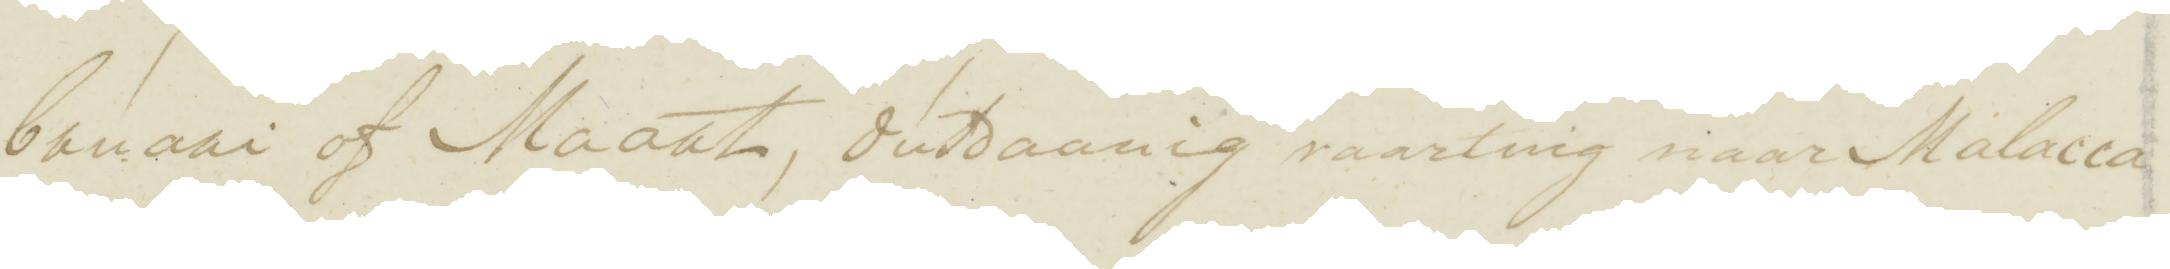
bruari of Maart, dusdaanig vaartuig naar Malacca
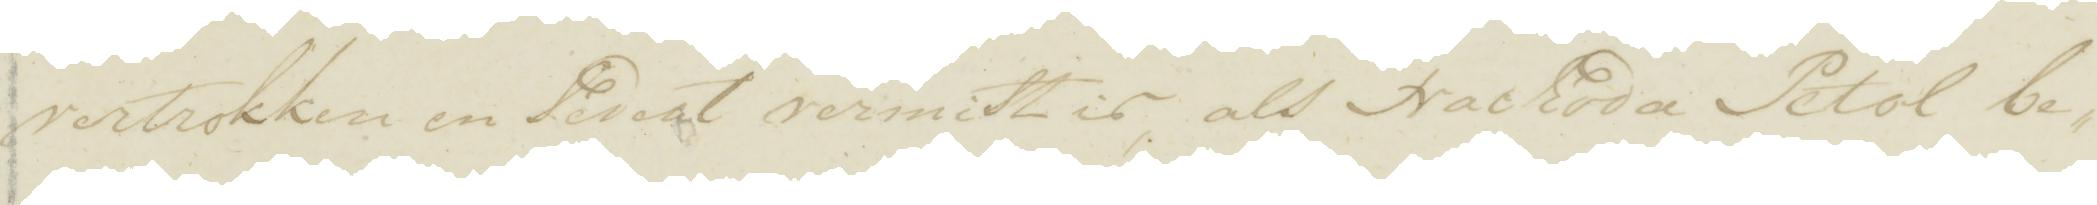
vertrokken en sedert vermist is, als Nachoda Petol be„
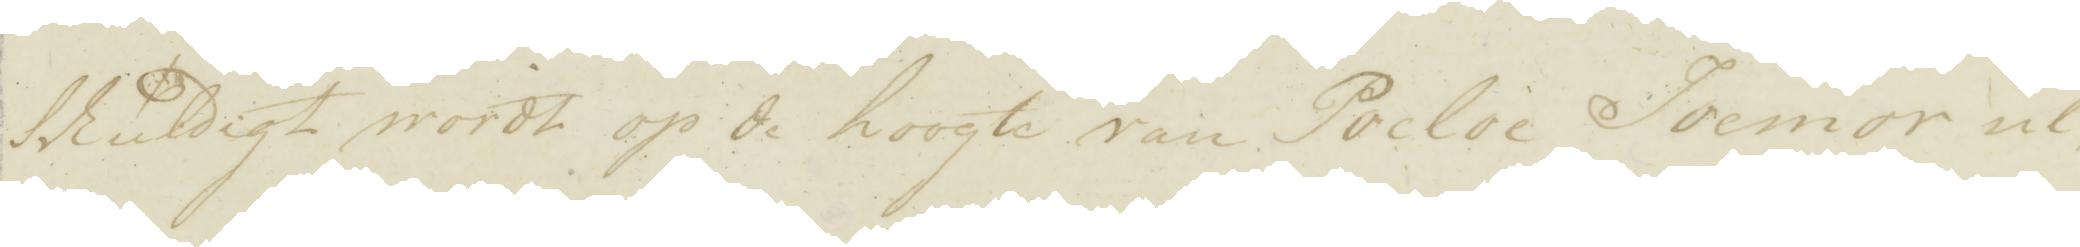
schuldigt wordt op de hoogte van Poeloe Ioemor ul
